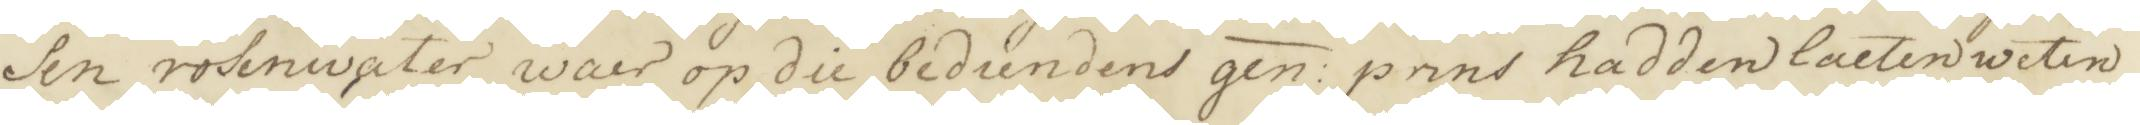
sen rosenwater waer op die bediendens gen: prins hadden laeten weten
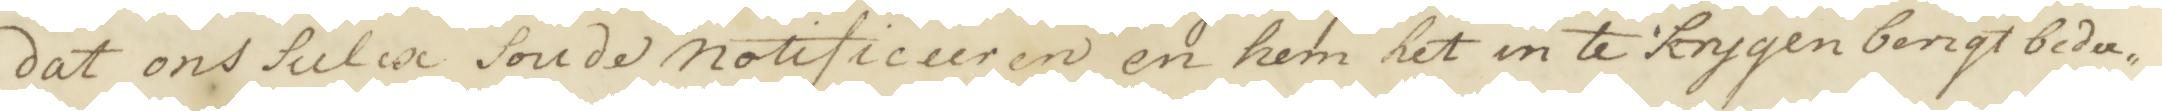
dat ons sulcx soude notificeeren en hem het in te krygen berigt bedee„
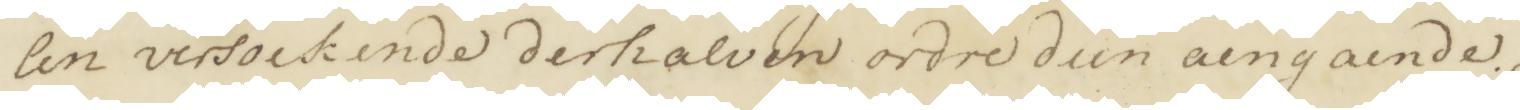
len versoekende derhalven ordre dien aengaende.
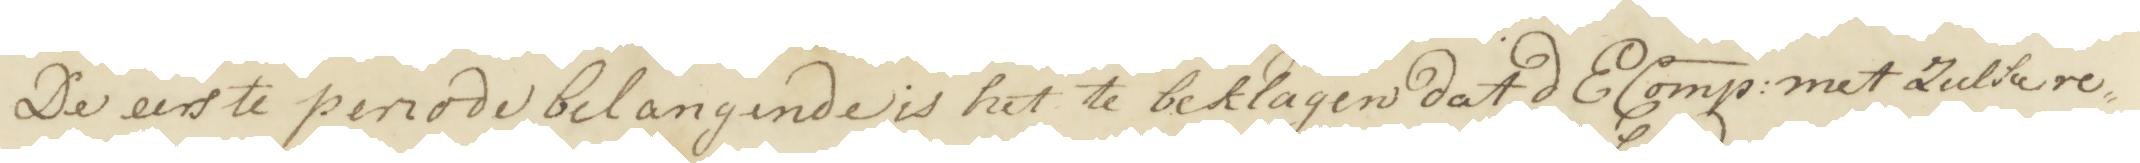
De eerste periode belangende is het te beklagen dat d E Comp: met zulke re„
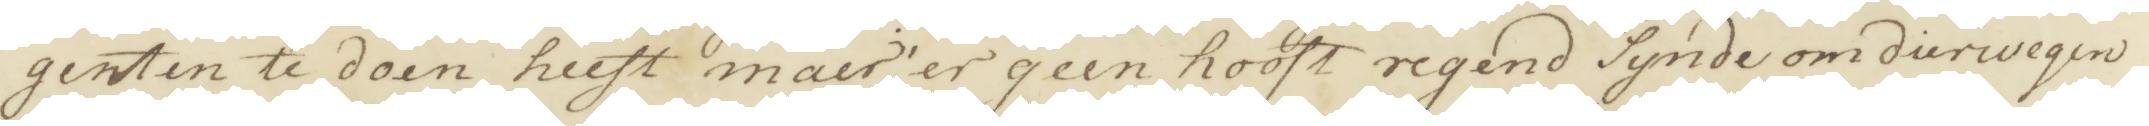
genten te doen heeft maer 'er geen hooft regend synde om dierwegen
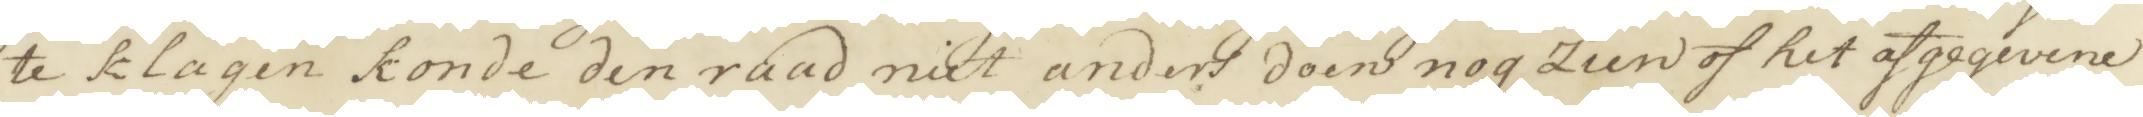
te klagen konde den raad niet anders doen nog zien of het afgegevene
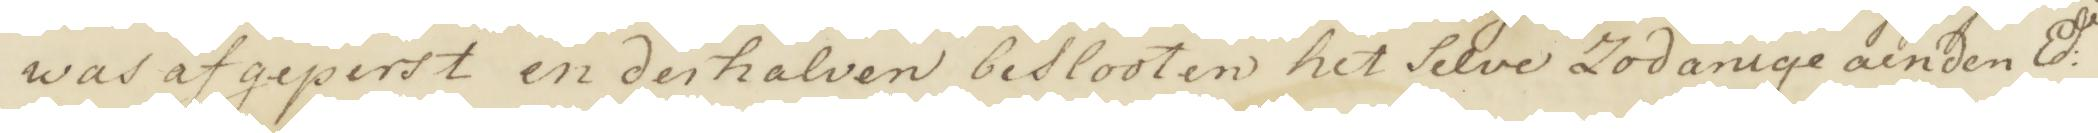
was afgeperst en derhalven beslooten het selve zodanige aen den Ed:e
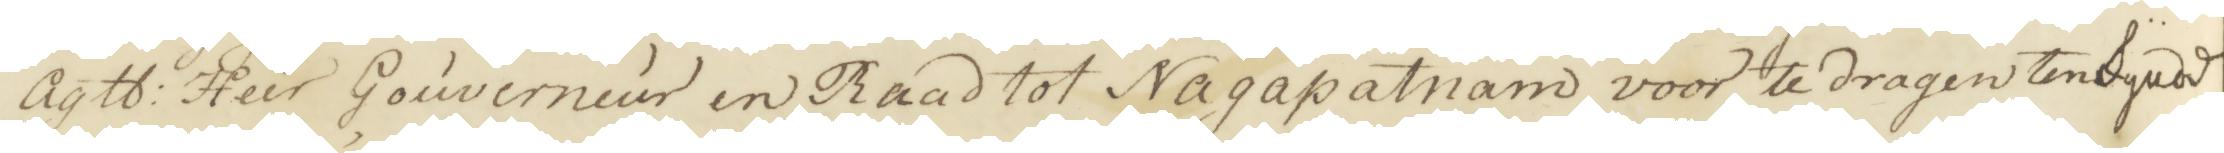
Agtb: Heer Gouverneur en Raad tot Nagapatnam voor te dragen ten Eijnde
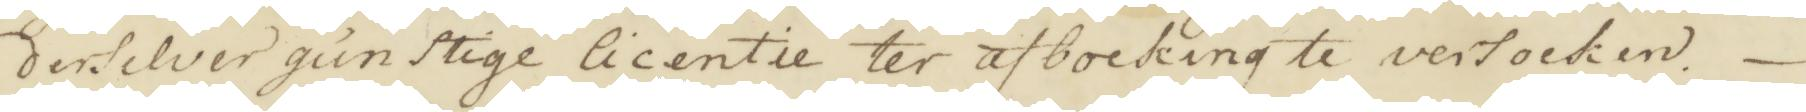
derselver gunstige licentie ter afboeking te versoeken.
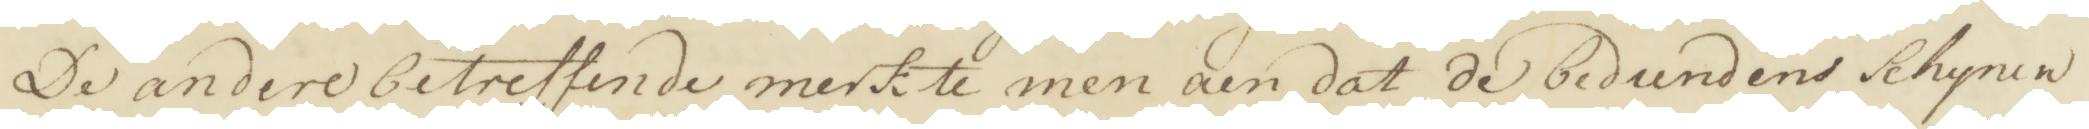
De andere betreffende merkte men aen dat de bediendens schynen
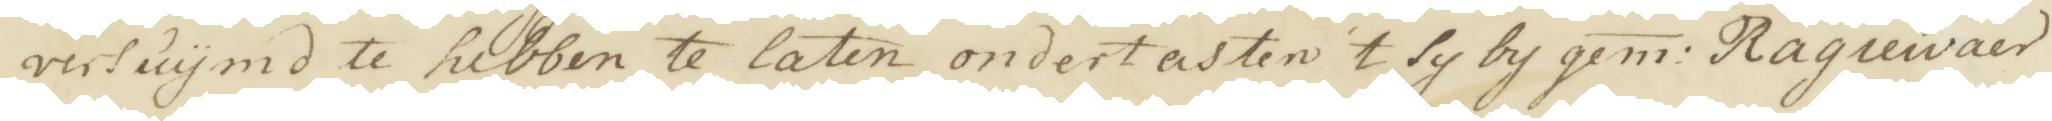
versuijmd te hebben te laten ondertasten ’t sy by gem: Ragiewaer
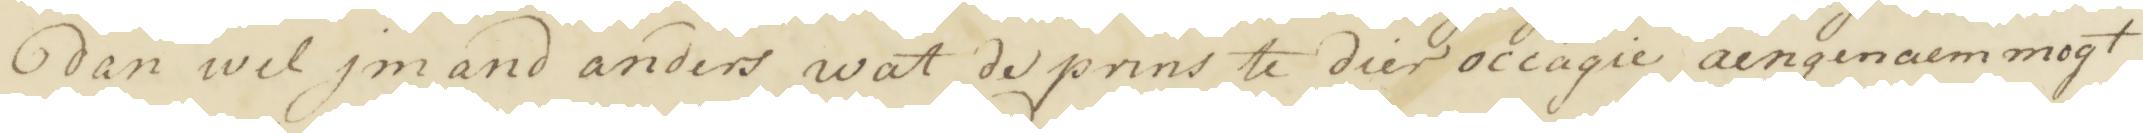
dan wel jmand anders wat de prins te dier occagie aengenaem mogt
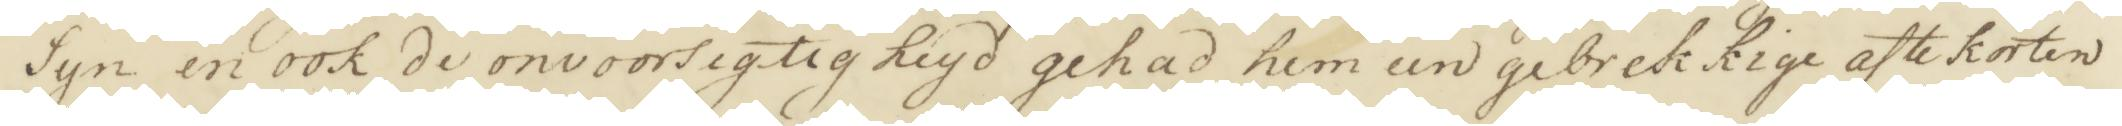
syn en ook de onvoorsigtigheyd gehad hem een gebrekkige afte korten
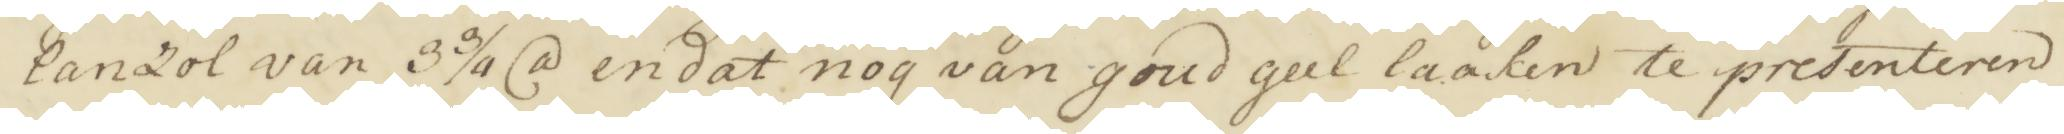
lanzol van 3¾ @ en dat nog van goud geel laaken te presenteren
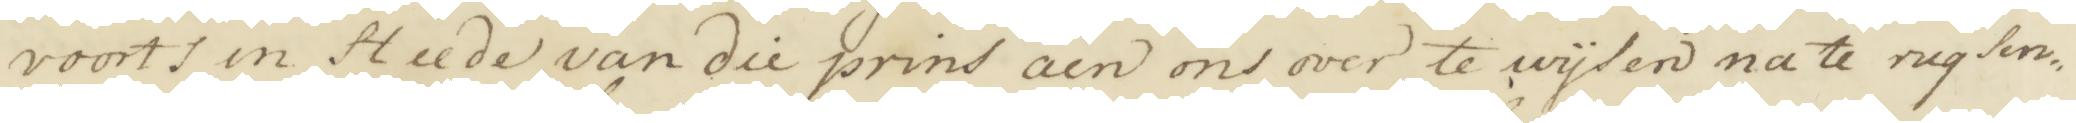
voorts in steede van die prins aen ons over te wijsen na te rug sen„
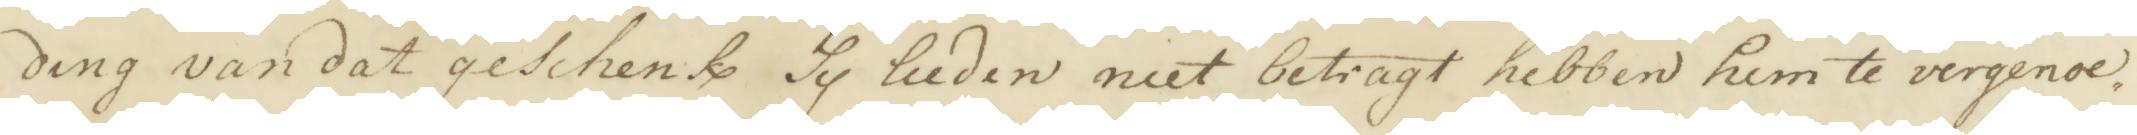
ding van dat geschenk sy lieden niet betragt hebben hem te vergenoe„
